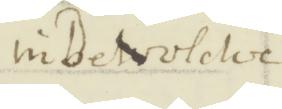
in De voldoe
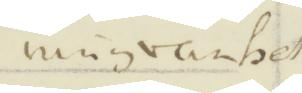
ning van het
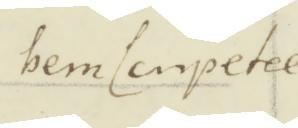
hem Competee
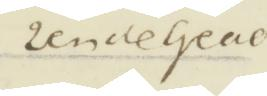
rende Gea
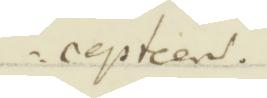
=cepteerd.
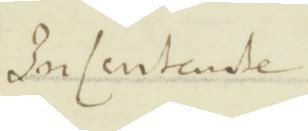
In Contante
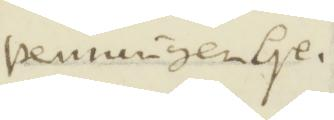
penningen Ge
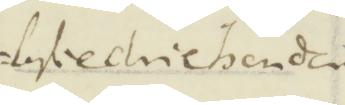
lyke drie honderd
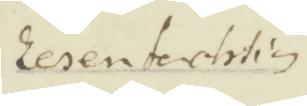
zes en tachtig
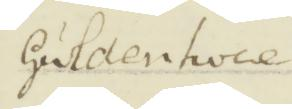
Gulden twee
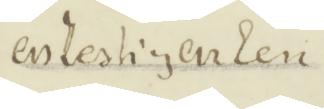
en zestig en Een
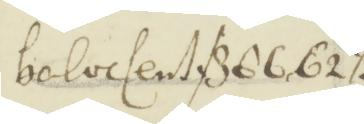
halve Cent ƒ366,62½
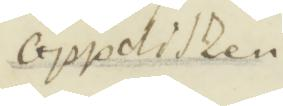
Appdit ren
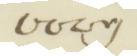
vooy
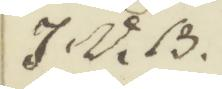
J,V,B.
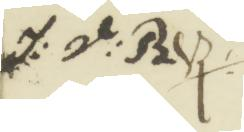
I: V: RVZ
